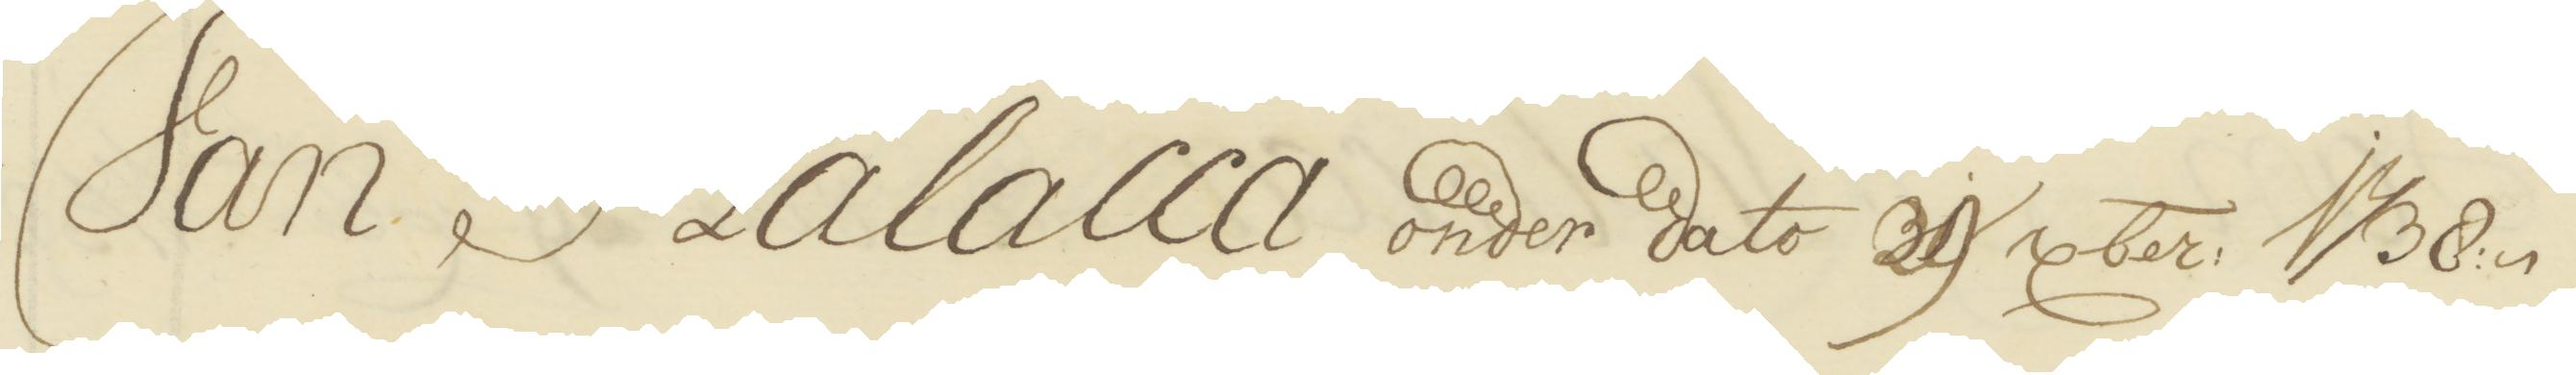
Van Malacca onder dato 29 xber: 1738:
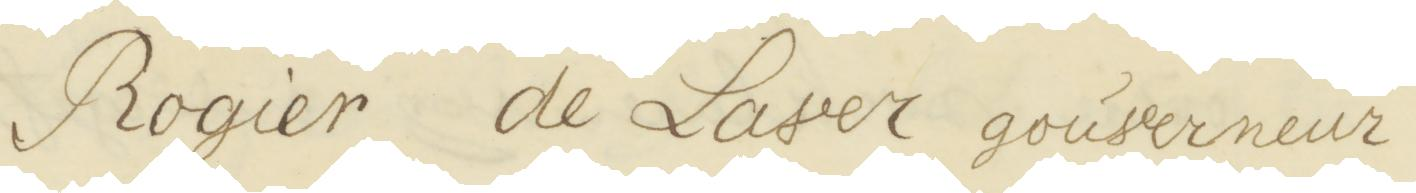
Rogier de Laver gouverneur
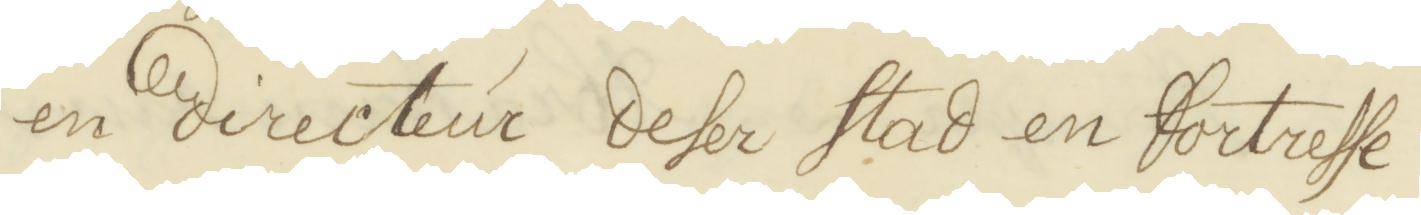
en directeur deser stad en fortresse
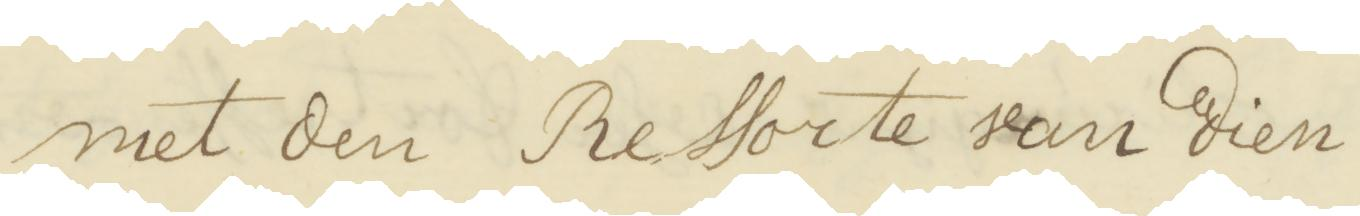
met den Ressorte van dien
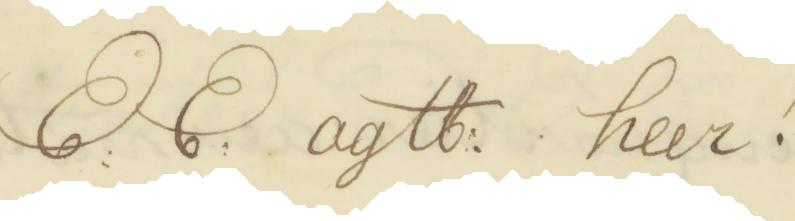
E: E: agtb:: heer!
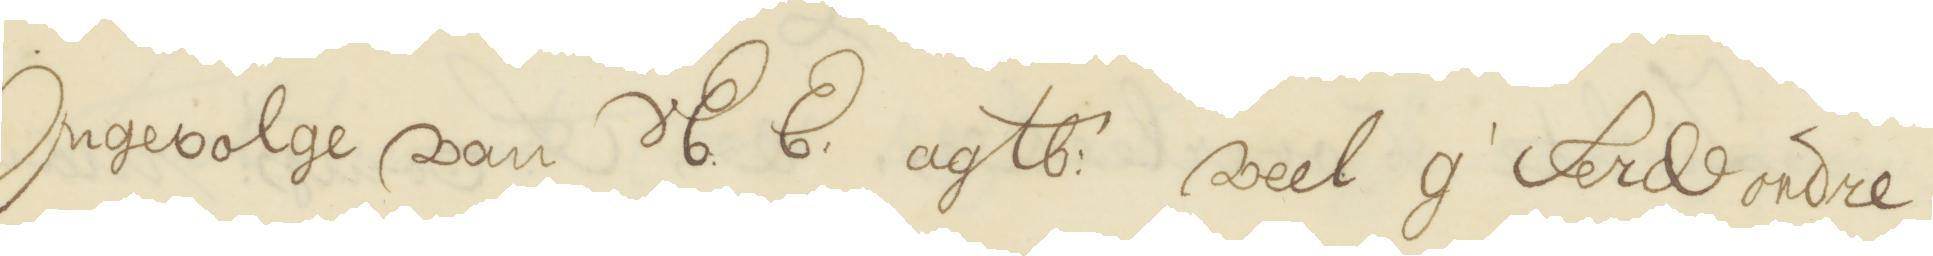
Ingevolge van UE: E: agtb: veel g’ Eerde ordre
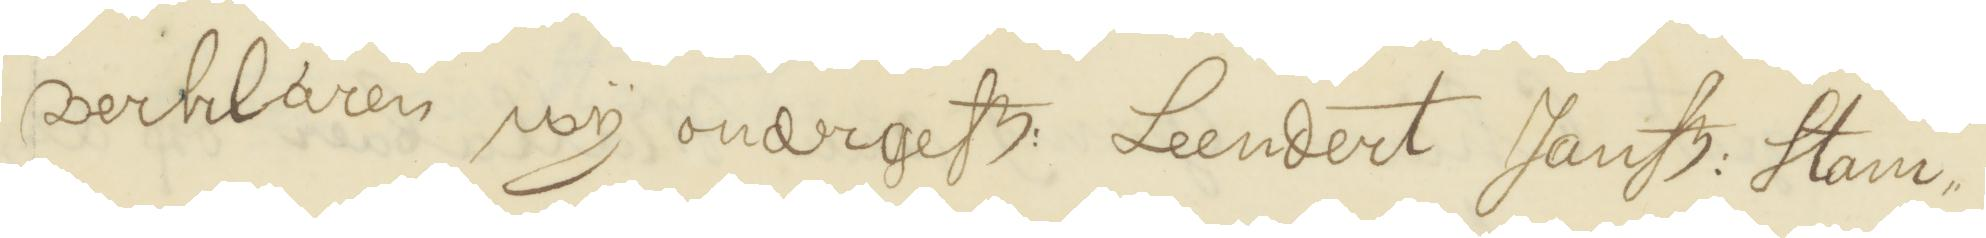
verklaren wij ondergesz: Leendert Jansz: Stam„
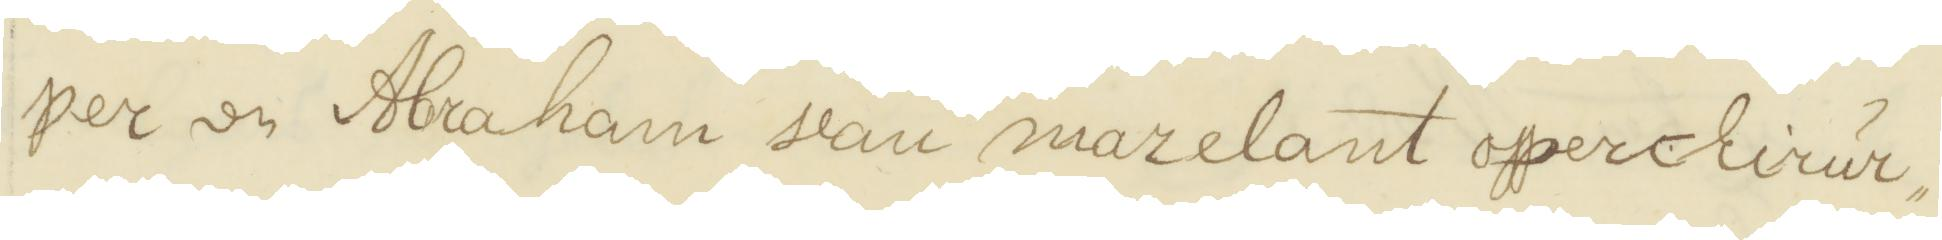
per en Abraham van marelant opperchirur„
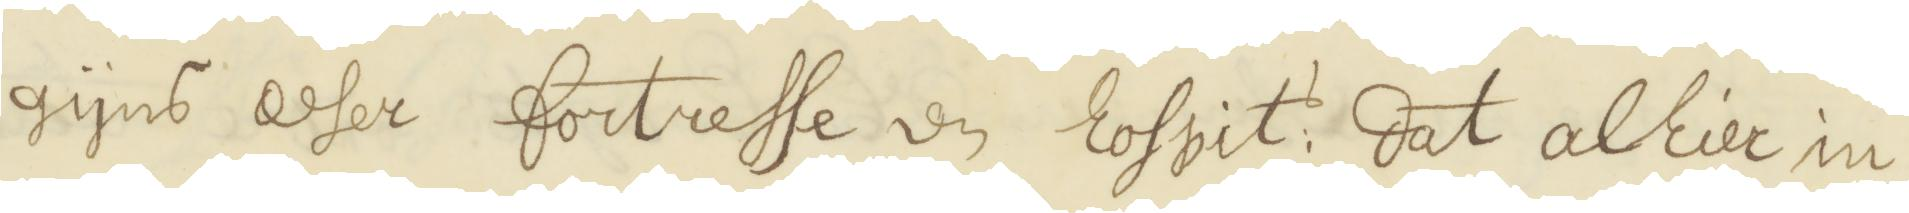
gijns deser fortresse en hospit: dat alhier in
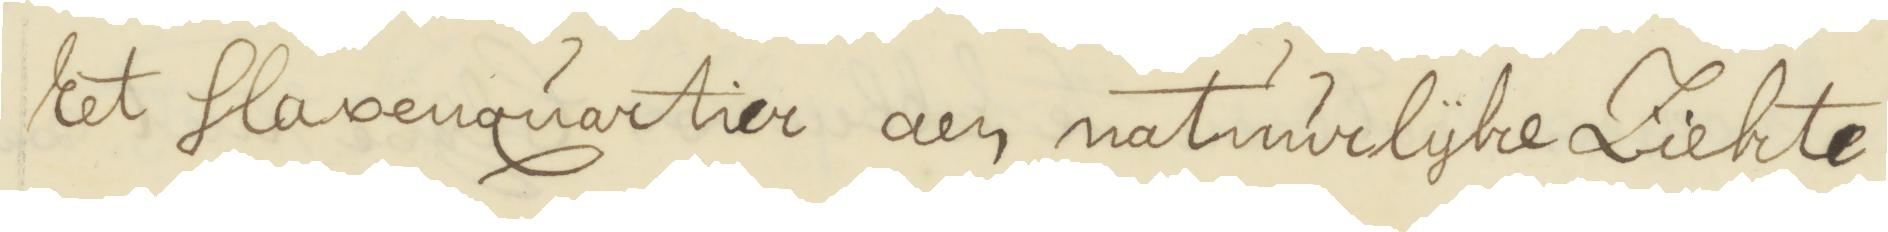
het slavenquartier aen natuurlijke ziekte
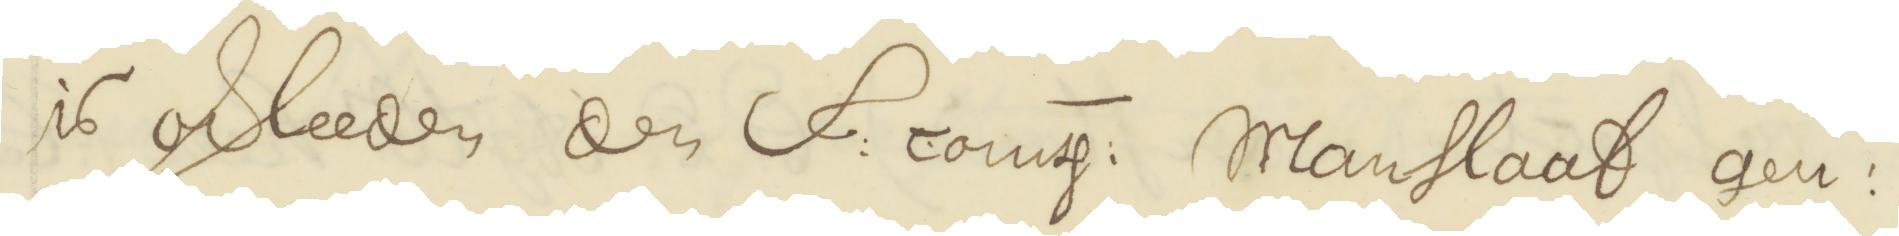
is overleeden den E: comp: Manslaaf gen:'t
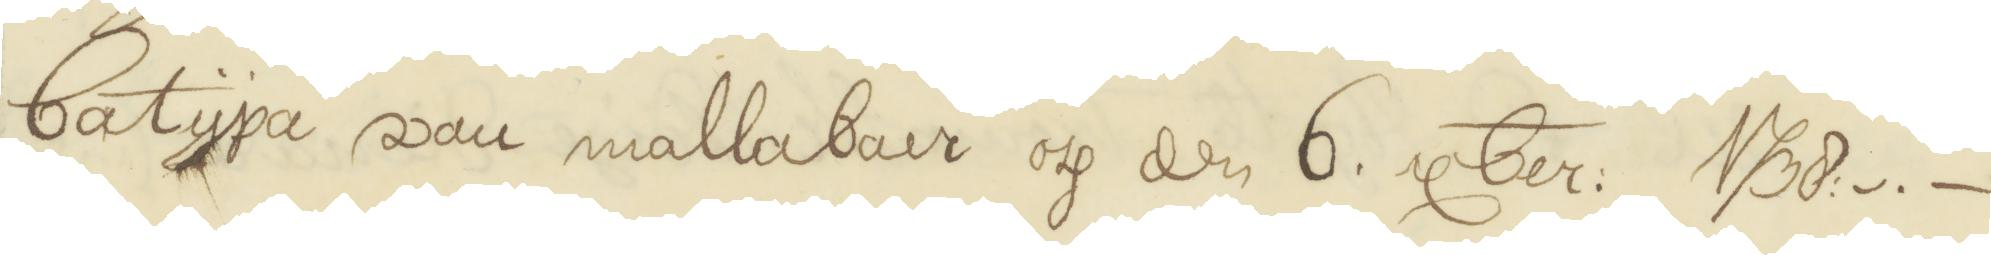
batijpa van mallabaer op den 6. xber: 1738:—.—
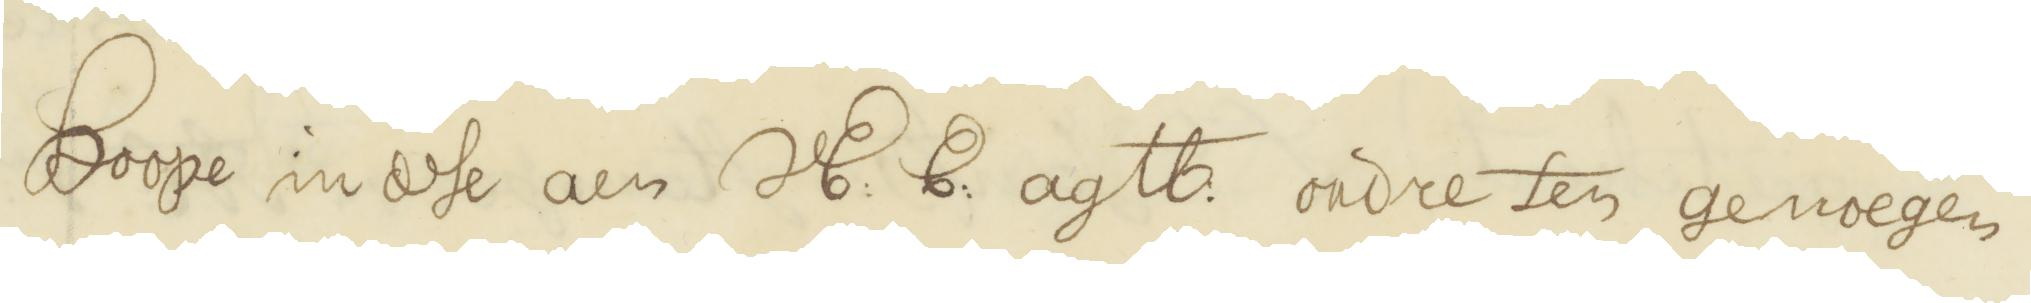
hoope in dese aen VE: E: agtb: ordre ten genoegen
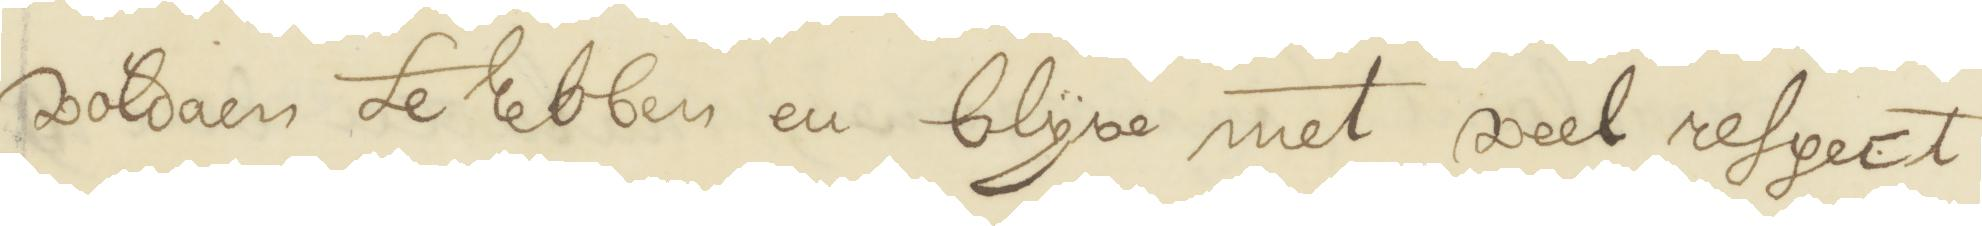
voldaen te hebben en blijve met veel respect
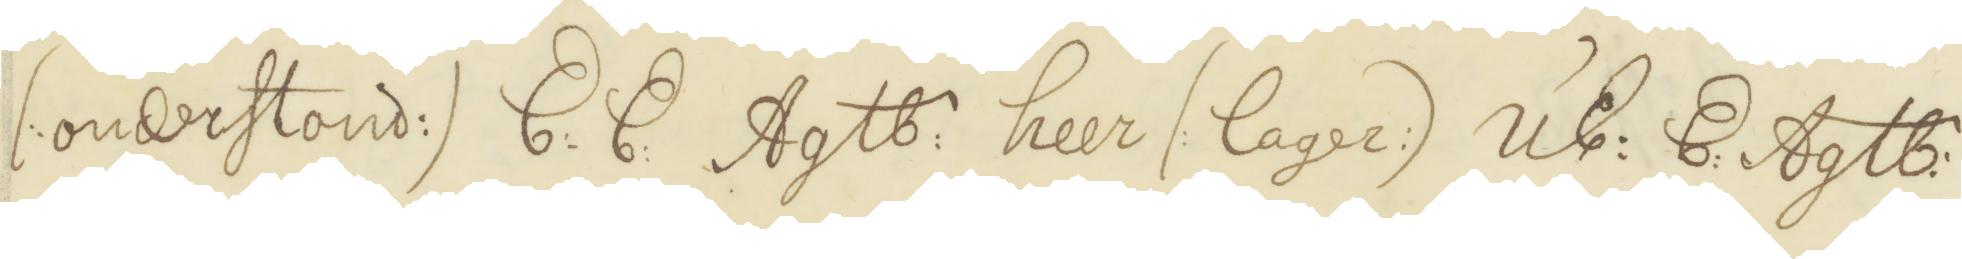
(:onderstond:) E: E: Agtb: heer (:lager:) uE: E: Agtb:
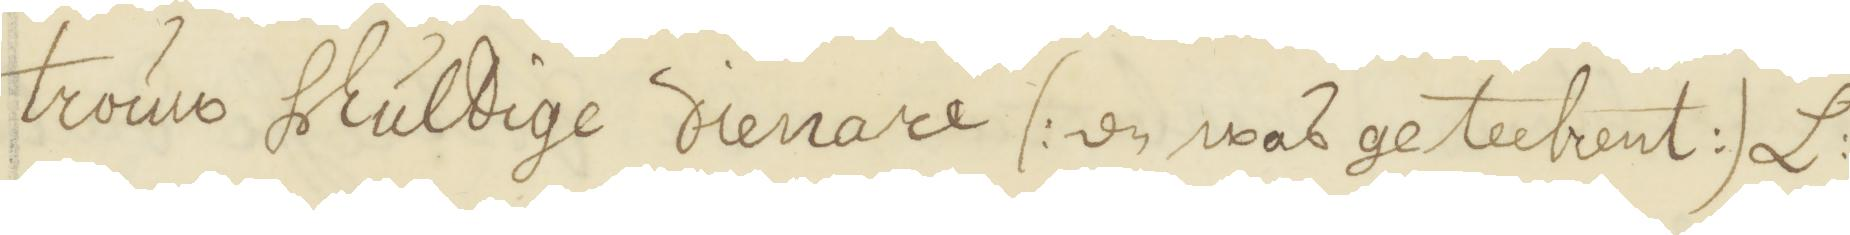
trouw schuldige dienare (:en was geteekent:) L
